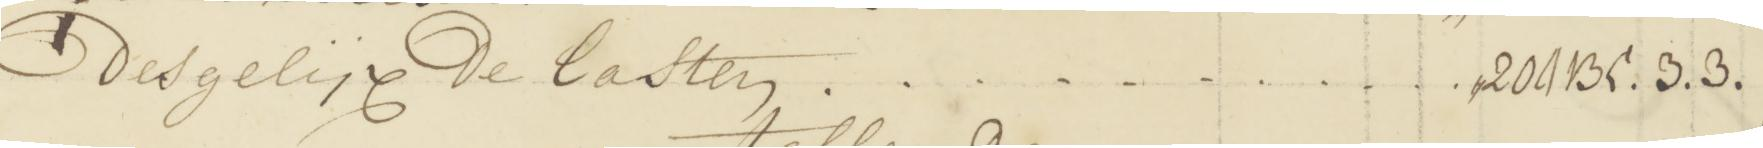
desgelijx de lasten . . . . . . . . . . . „204135.3.3.
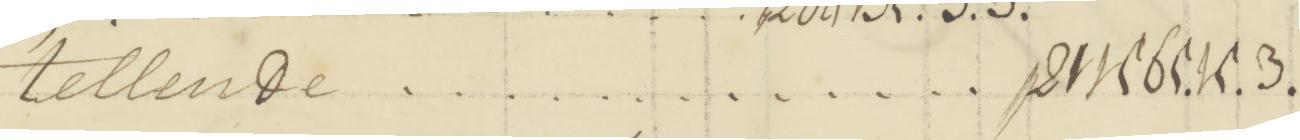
tellende . . . . . . . . . . . . . „211565.15.3
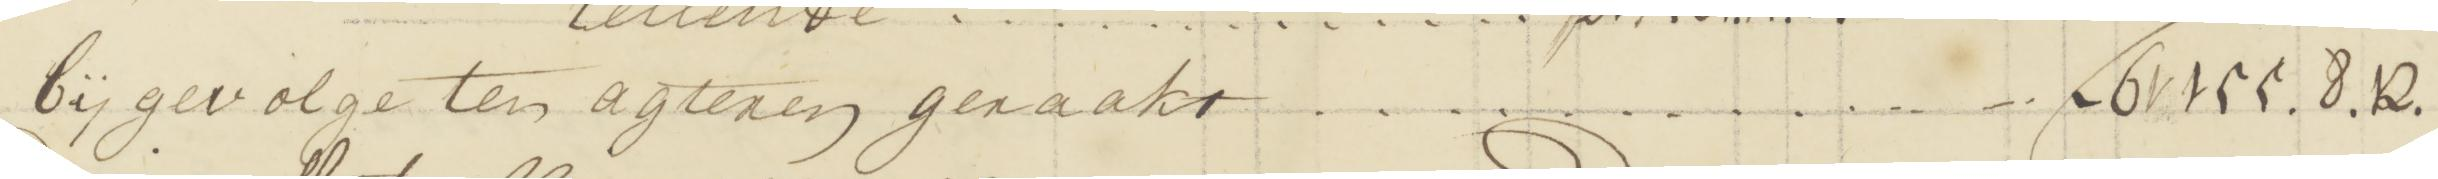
bij gevolge ten agteren geraakt . . . . . . . . . . . . . . ƒ61155.8.12.
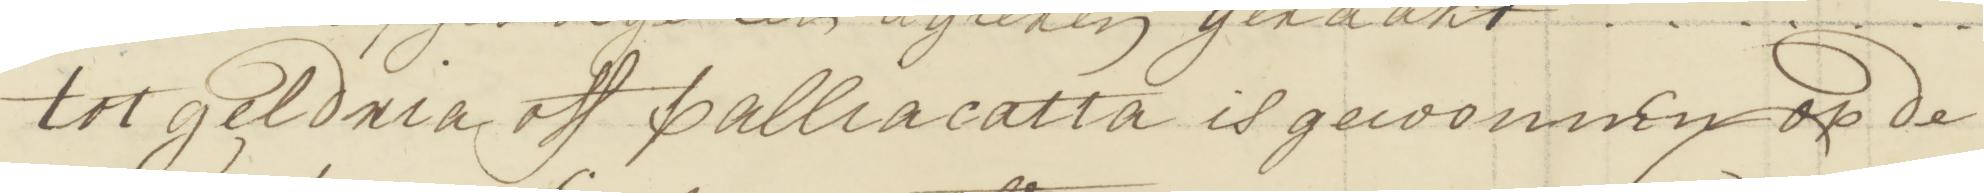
tot geldria off palliacatta is gewonnen op de
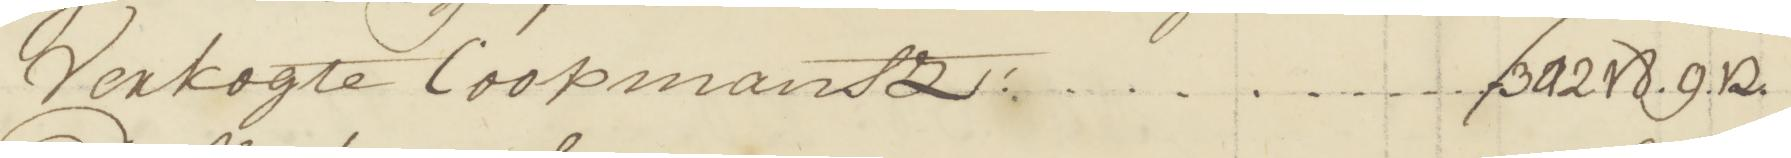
Verkogte Coopmansz: . . . . . . . . .ƒ34218.9.12.
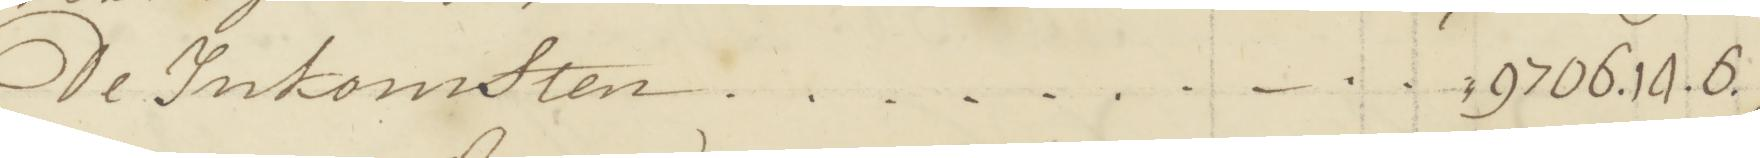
de Inkomsten . . . . . . . . . . „9706.14.6.
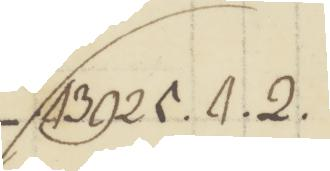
ƒ43925.4.2.
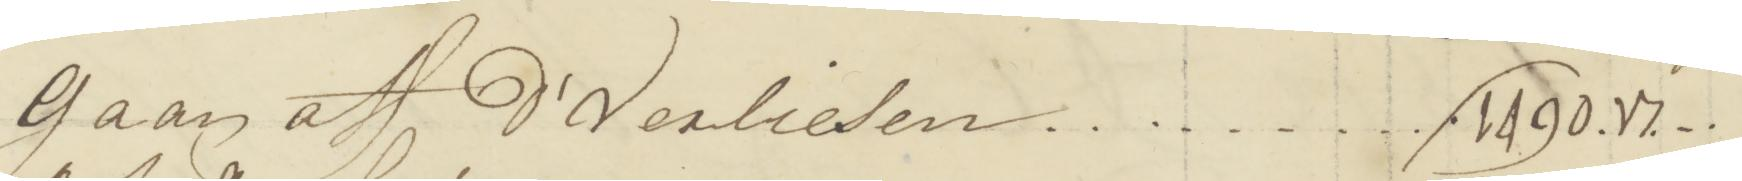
gaan aff d’ verliesen . . . . . . . . . ƒ1490.17.-.
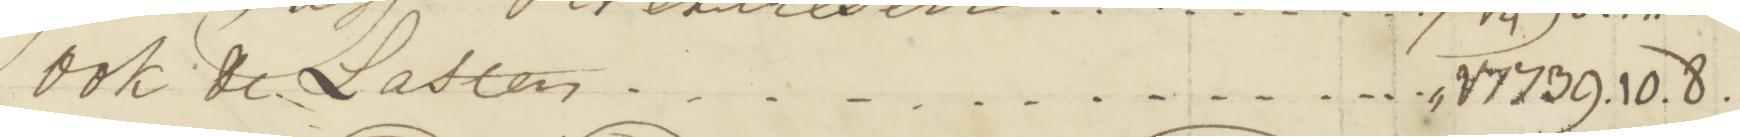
ook de Lasten . . . . . . . . . . . . . . . „17739.10.8.
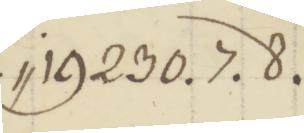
„19230. 7.8
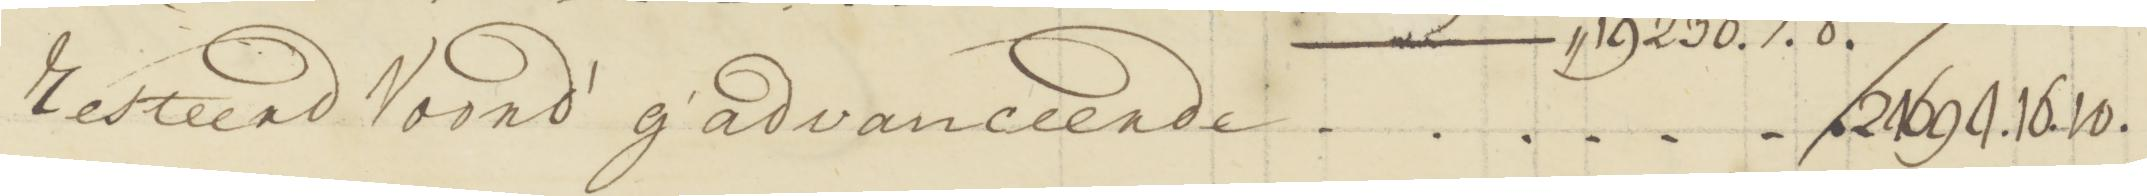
Resteerd voord' g’advanceerde . . . . . . ƒ24694.16.10.
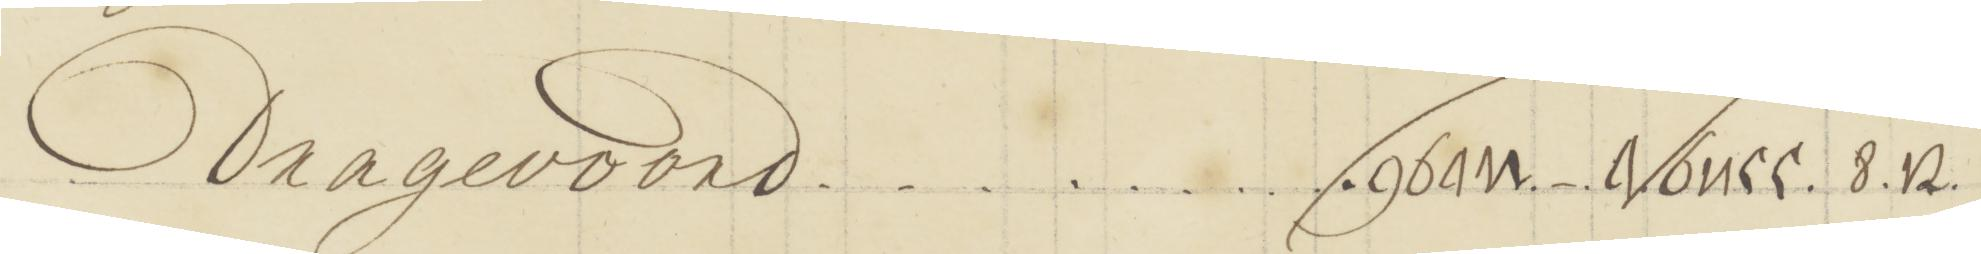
dragevoord . . . . . . . . .ƒ96411.-. 4 ƒ61155.8.12.
